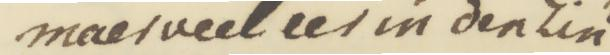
maer veel eer in den zin
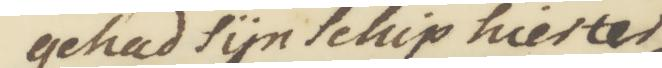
gehad sijn schip hier ter
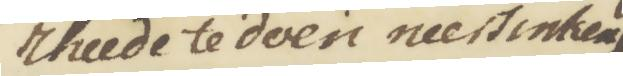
rheede te doen neersinken
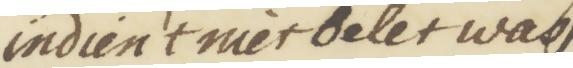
indien ’t niet belet was
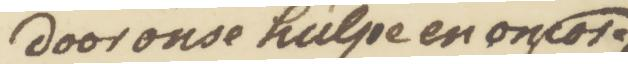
door onse hulpe en oncos=
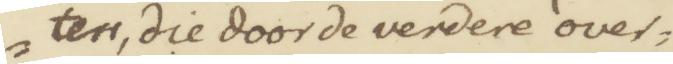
=ten, die door de verdere over=
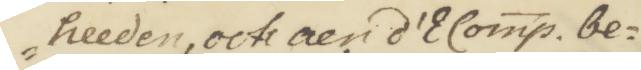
=heeden, ook aen d' EComp. be=
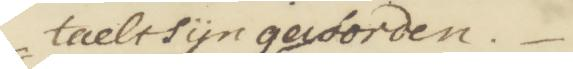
=taelt sijn geworden. —
